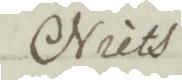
Niets
